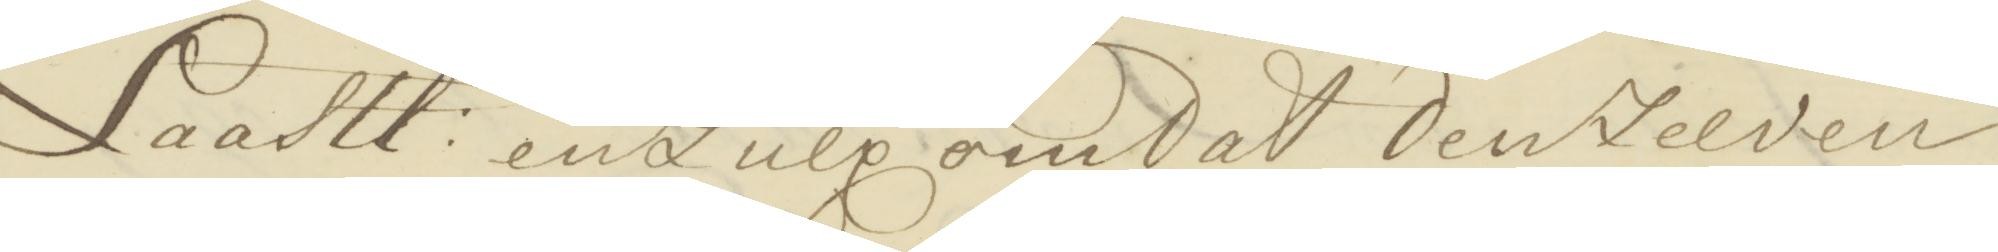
Laastl: en zulx om dat den zelven
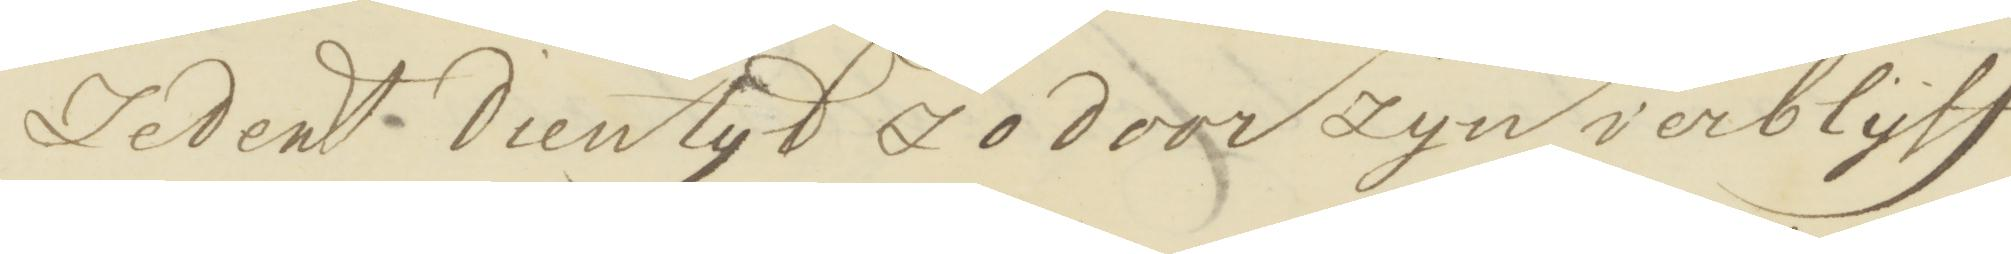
Zedert dien tyd zo door zijn verblijff
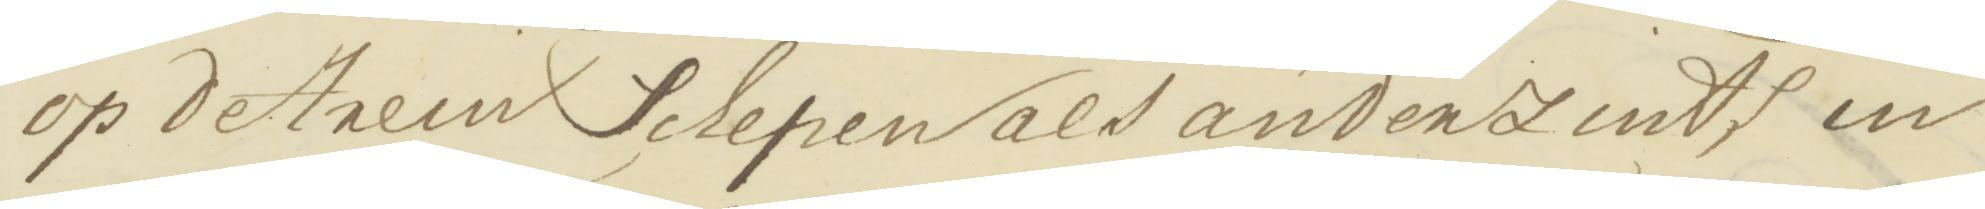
op de trein Schepen als anderzints in
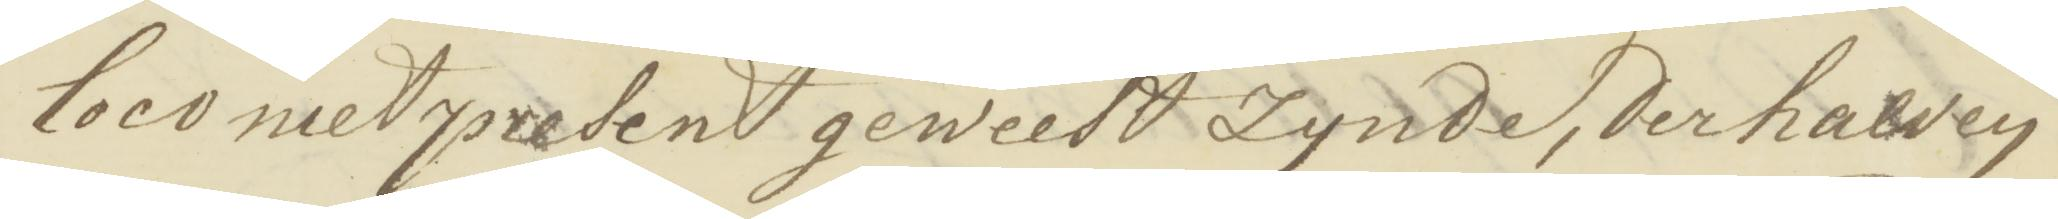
loco niet present geweest zynde, derhalven
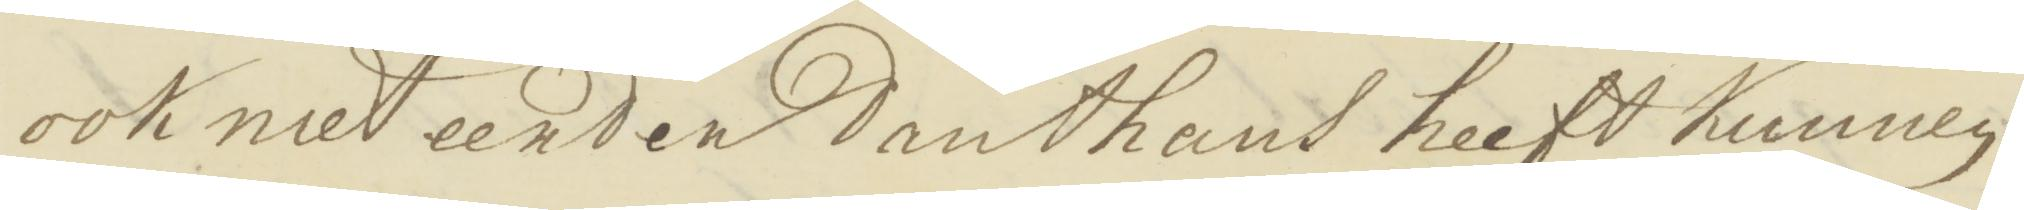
ook niet eeerder dan thans heeft kunnen
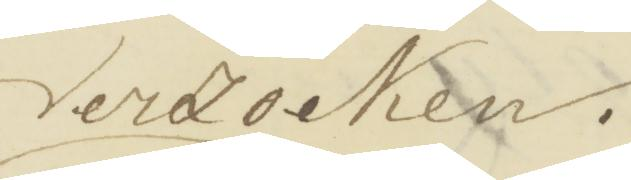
Verzoeken.
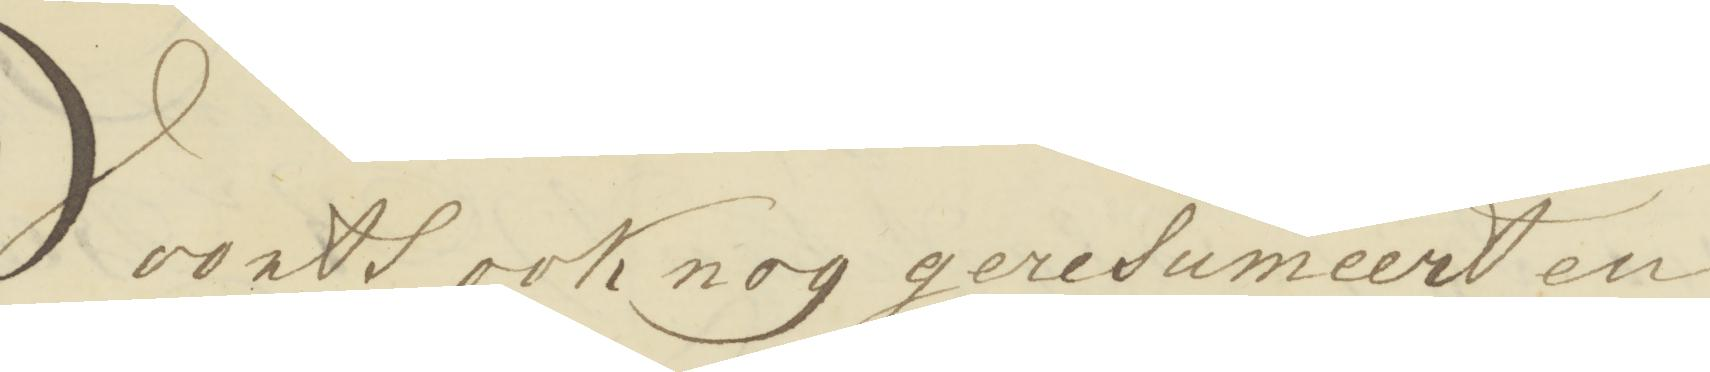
Voorts ook nog geresumeert en
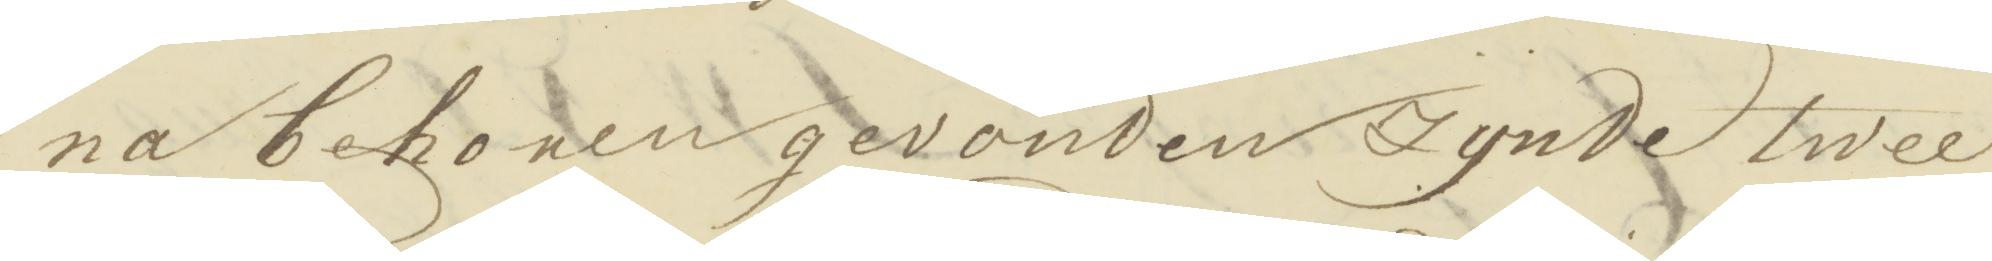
na behoren gevonden zynde twee
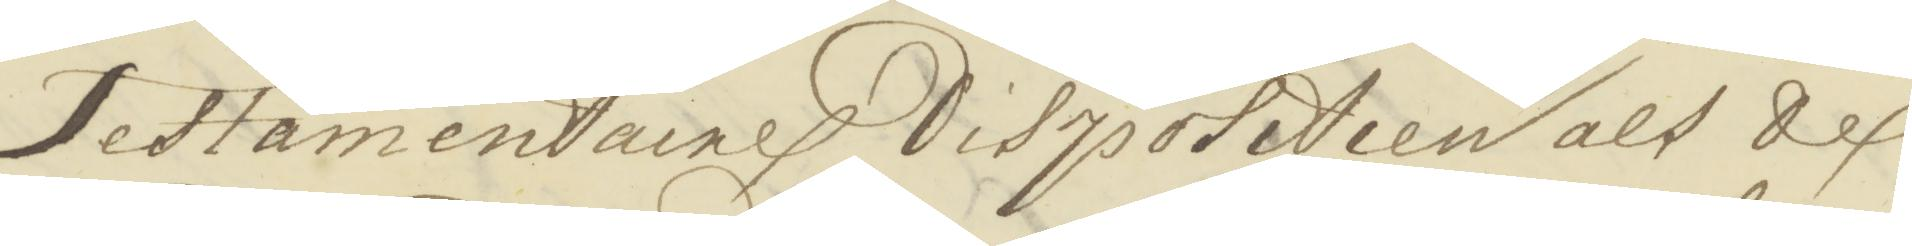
Testamentair dispositien als de
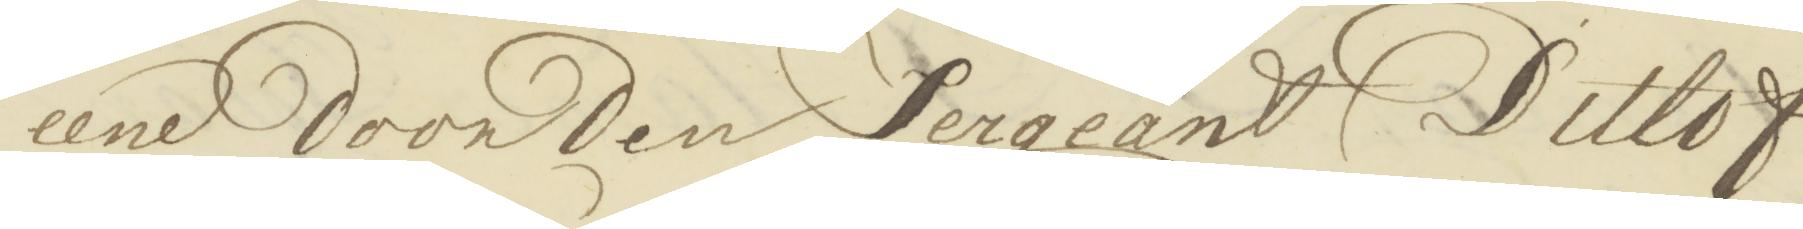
eene door den Pergeand Ditlof
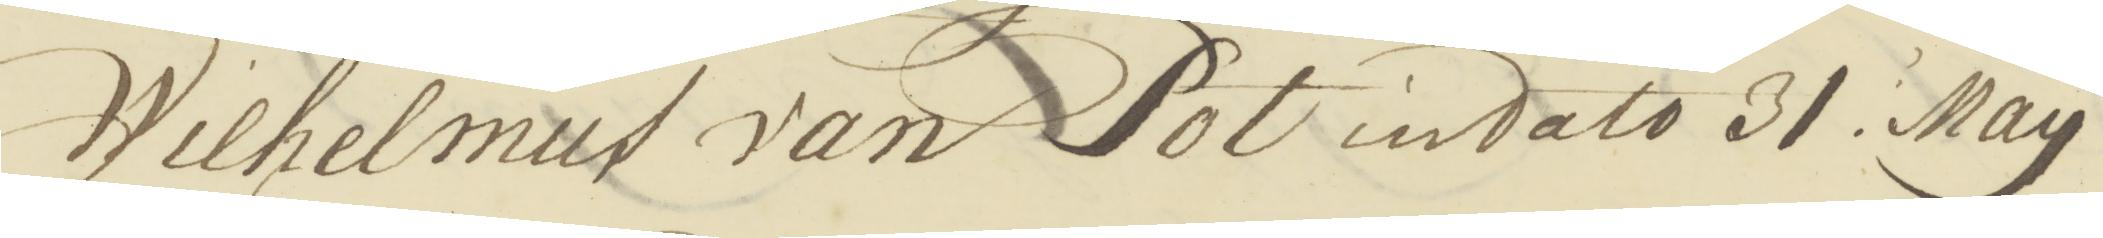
Wilhelmus van Pot in dato 31:' May
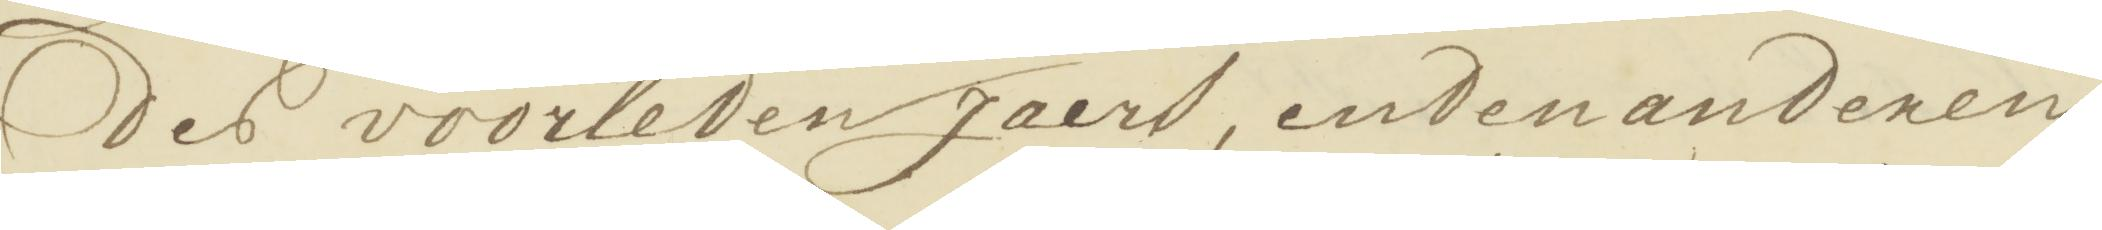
des voorleden jaers, en den anderen
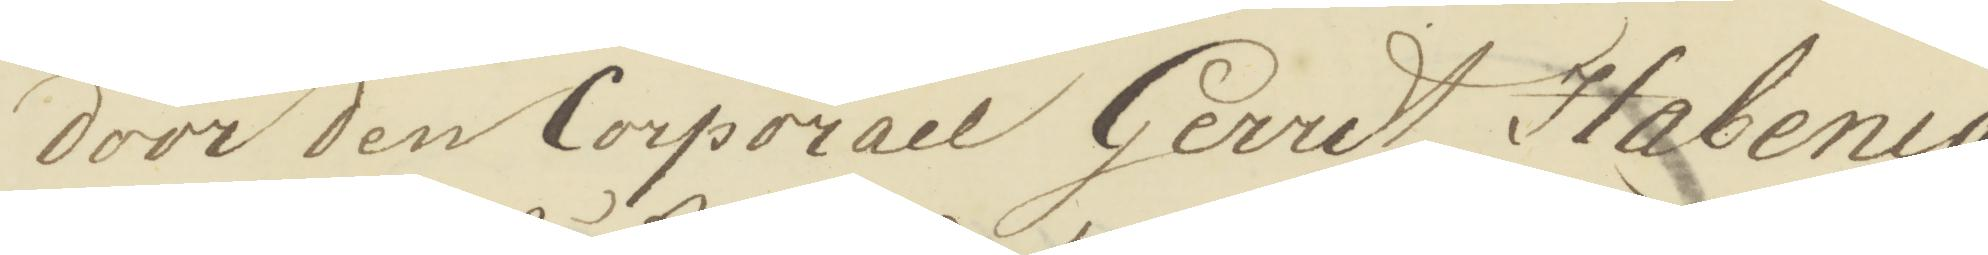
door den Corporael Gerrit Habenig
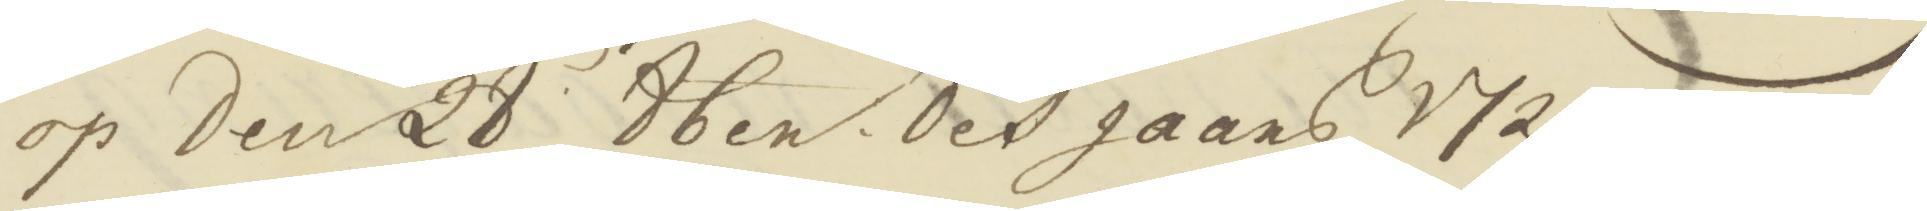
op den 28 8ber. des jaars 1729. voor
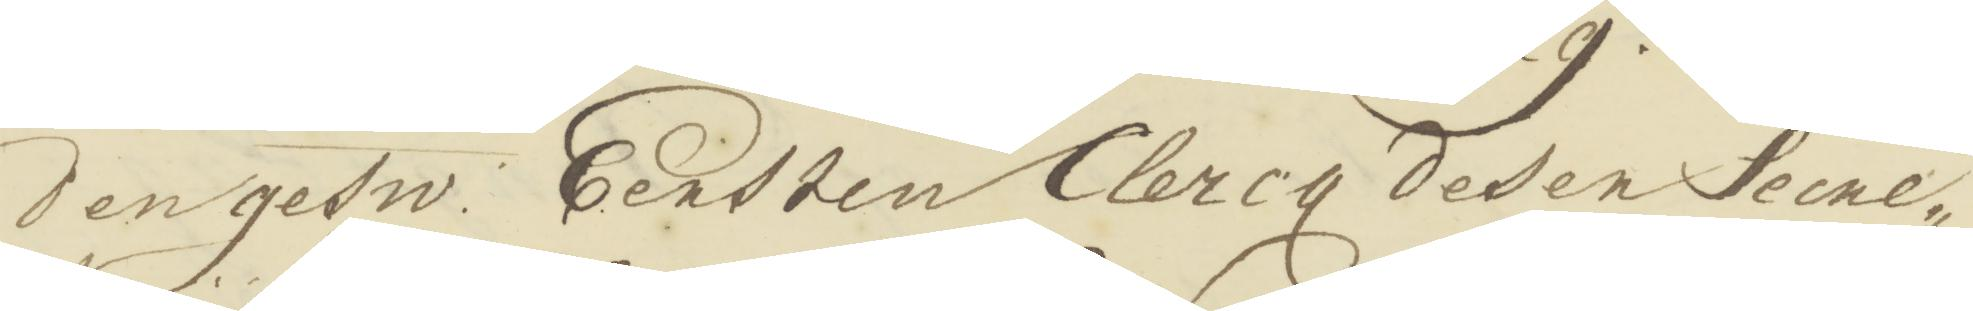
den gesw: Eersten Clercq deser secre„
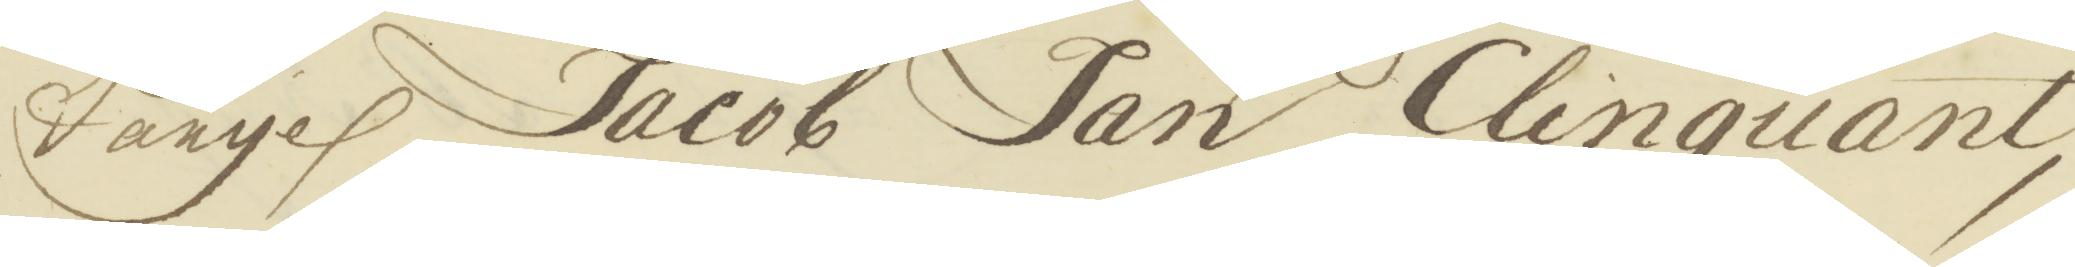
tarije Iacob Ian Clinquant,
